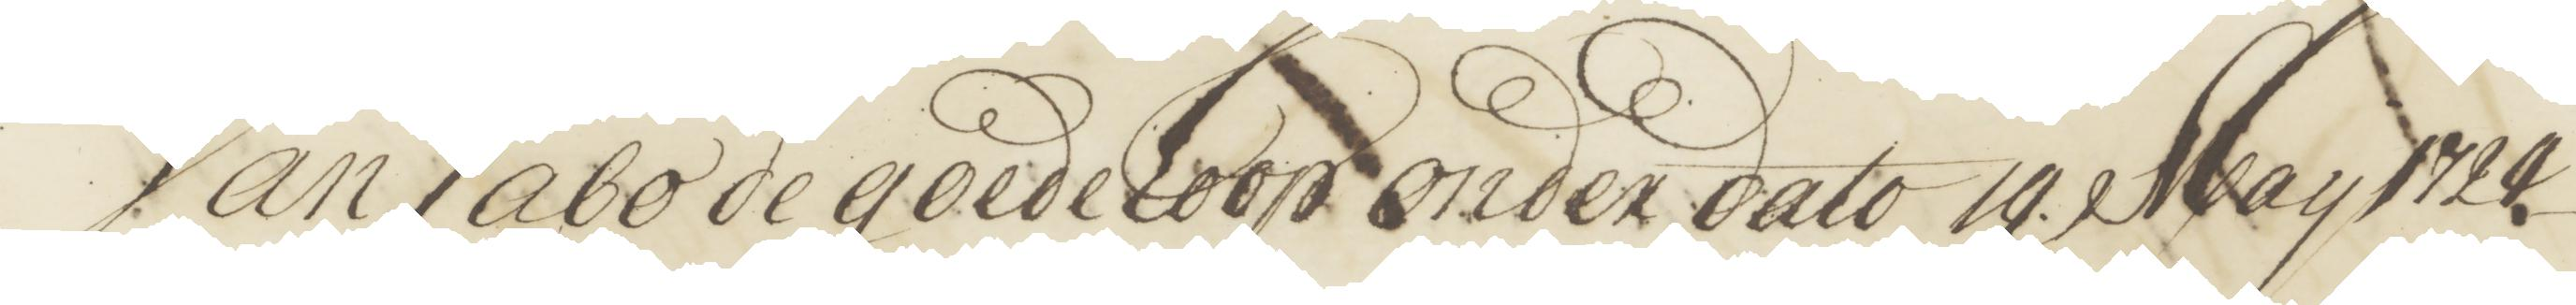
Van Cabo de goede hoop onder dato 19. May 1724.
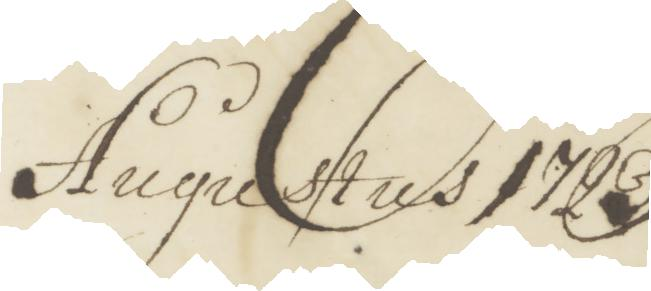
Augustus 1723
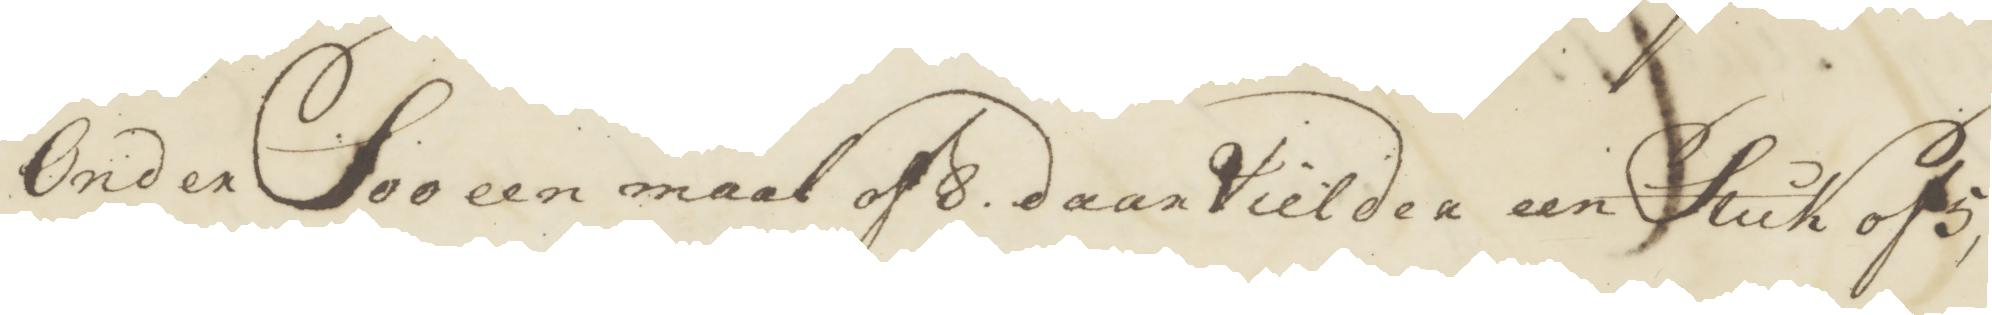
Onder Soo een maal of 8. daar vielder een Stuk of 5
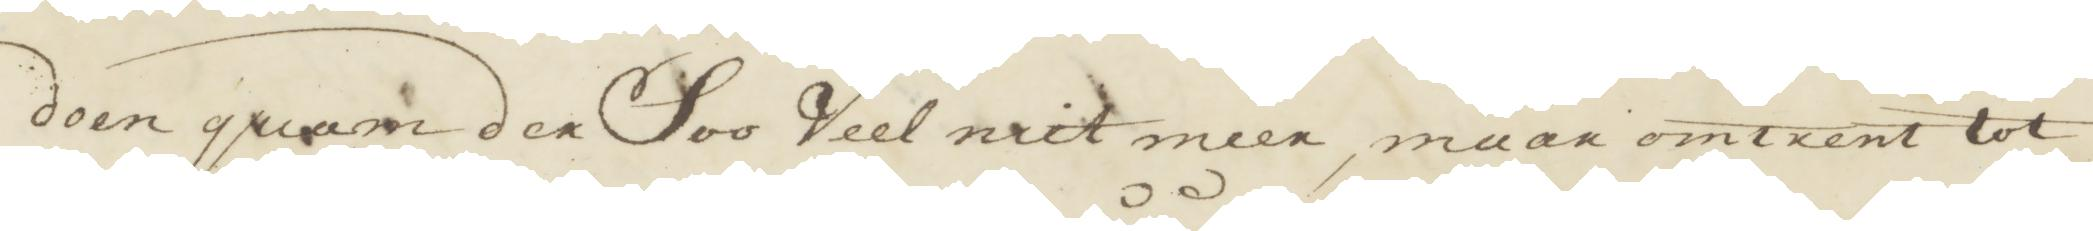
doen quam der Soo veel niet meer, maar omtrent tot
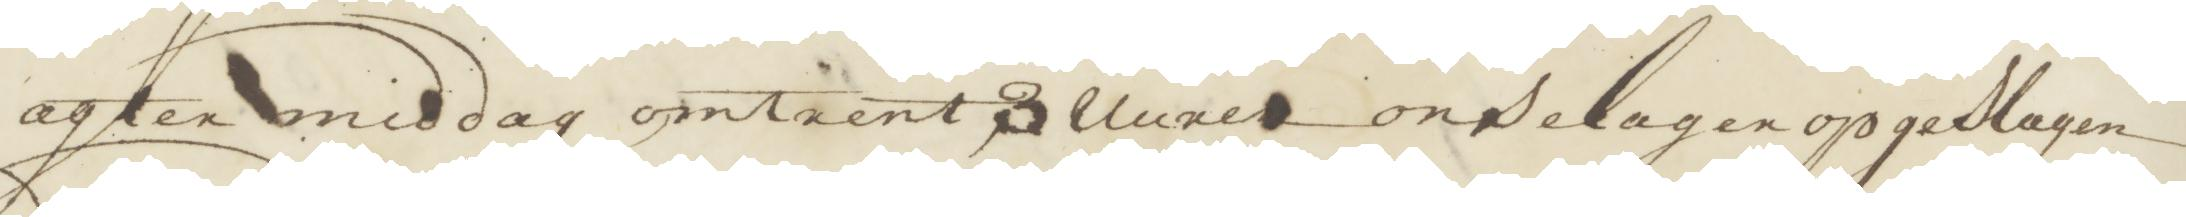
agter middag omtrent 3 uure onse lager opgeslagen
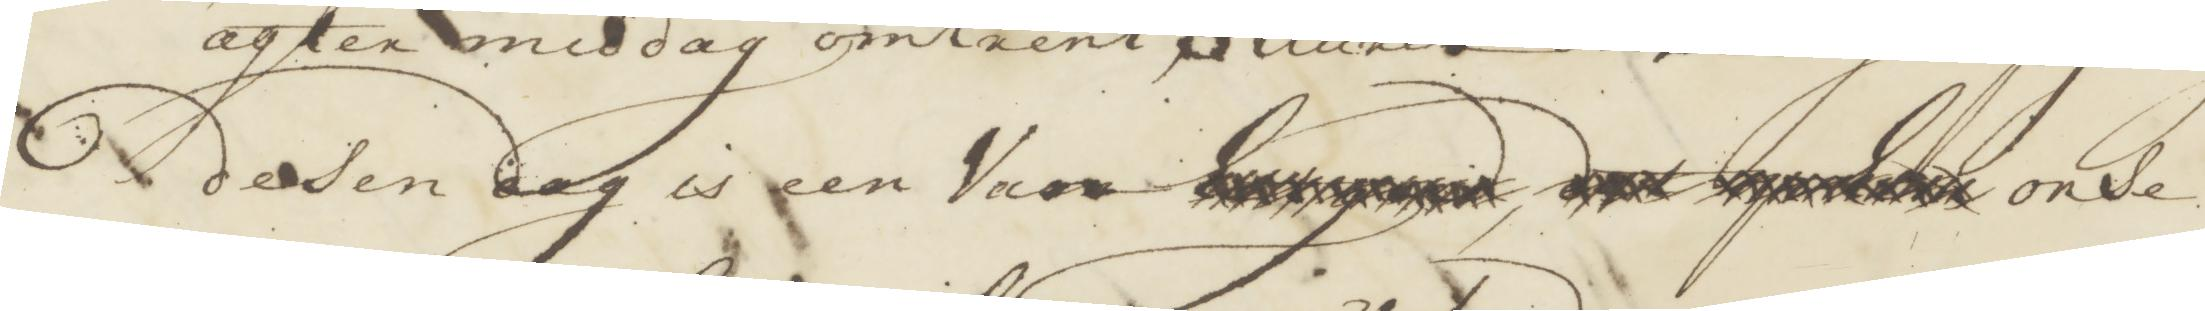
desen dag is een voor heyaart, dat probaat onse
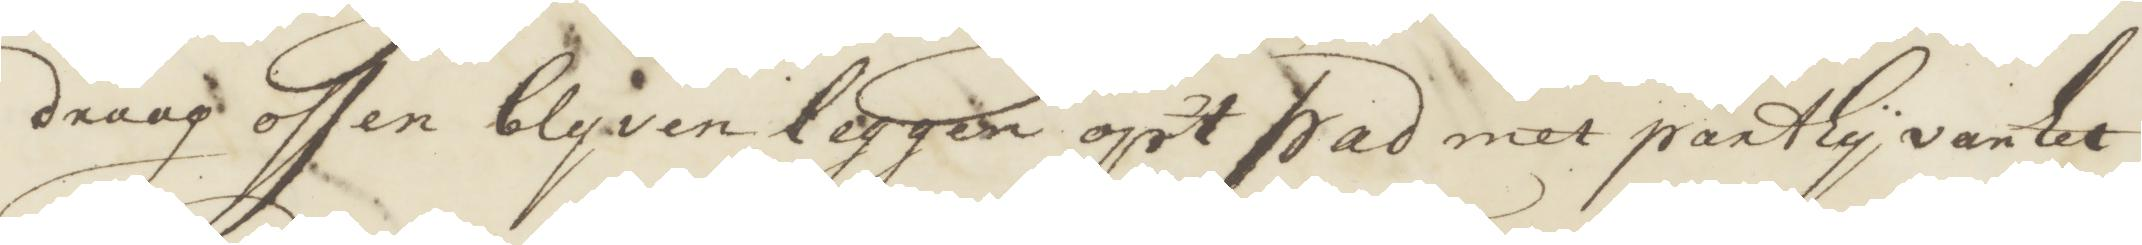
droog offen blyven leggen op ’t pad met parthij van het
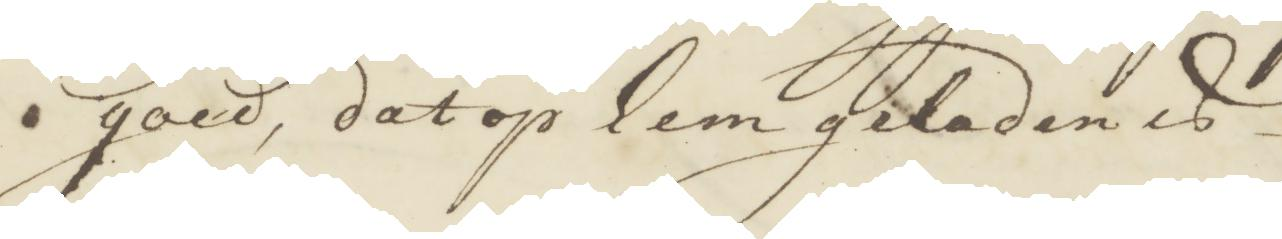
goed, dat op hem geladen is
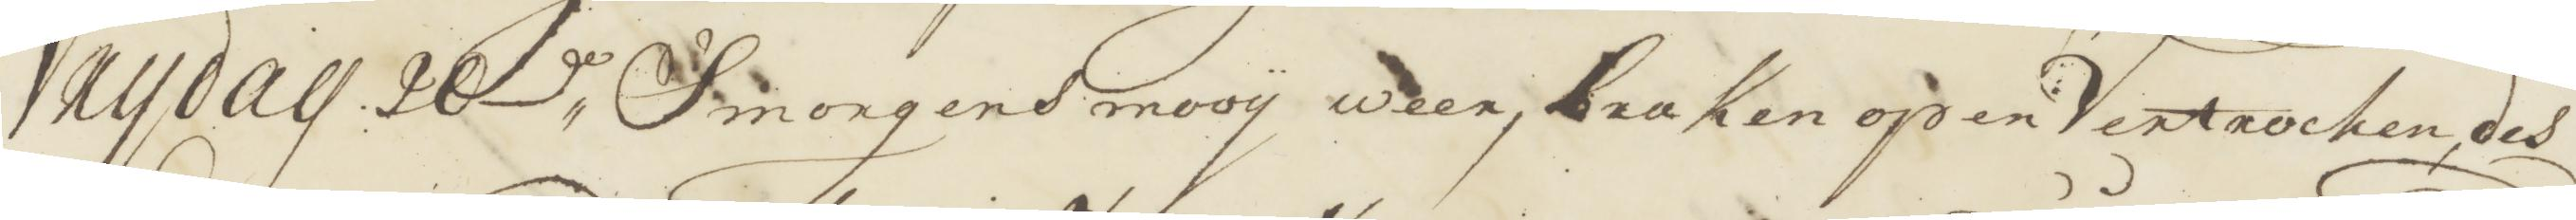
Vrydag 20 _„o Smorgens mooij weer, braken op en vertrocken, des
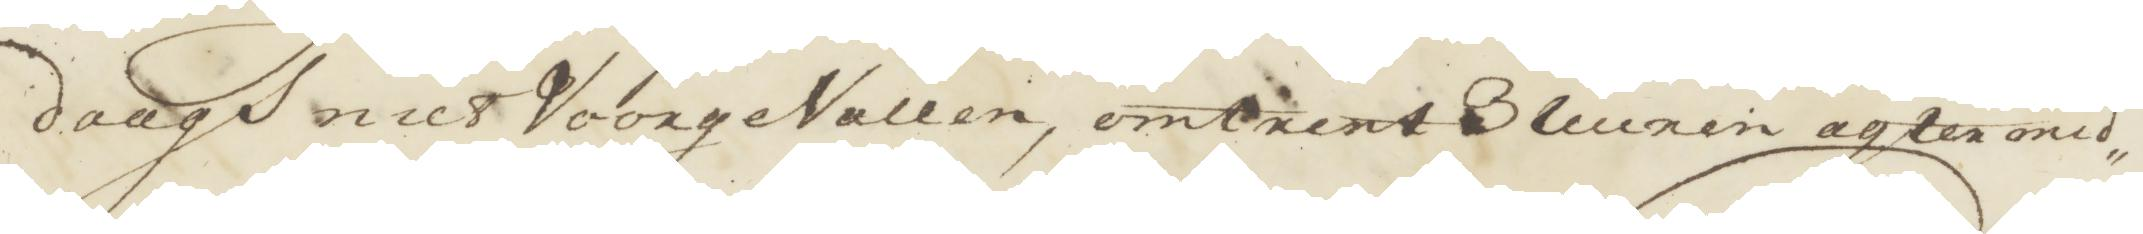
daags niet voorgevallen, omtrent 3 uuren agter mid„
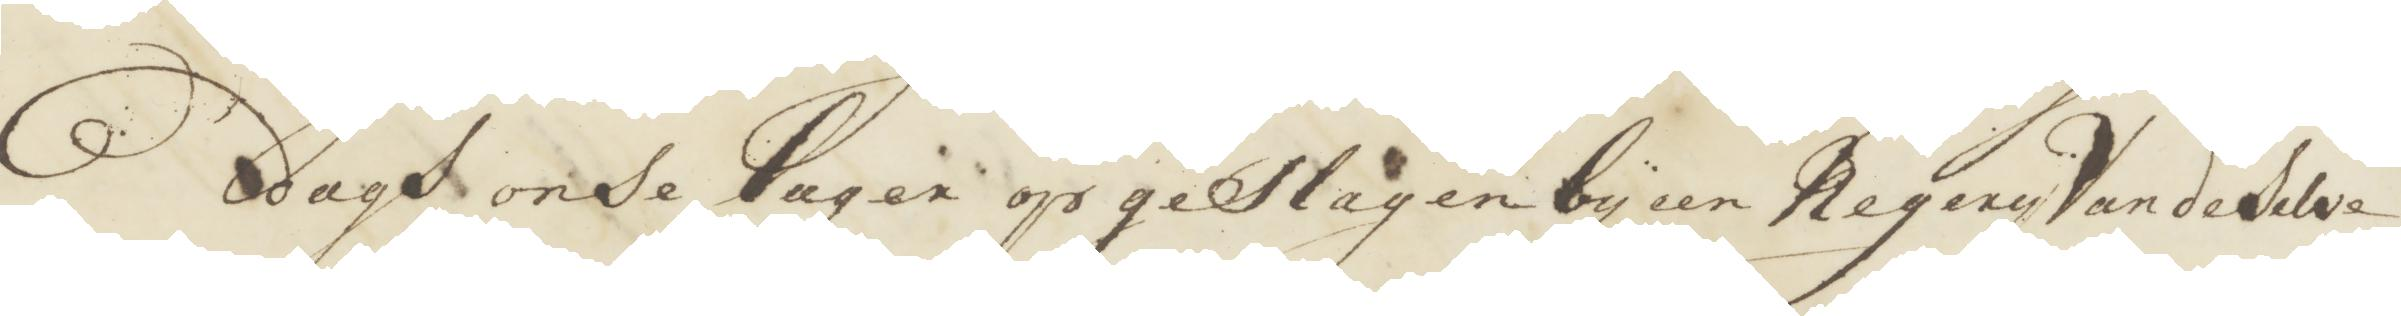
dags onse lager op geslagen bij een Negerij van deselve
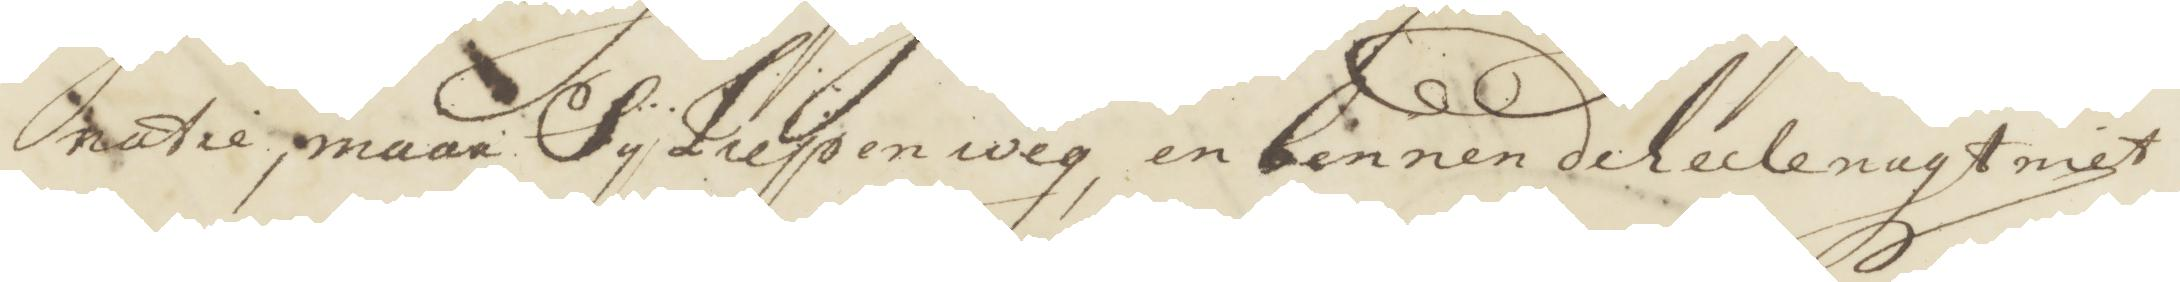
natie, maar Sij Liepen weg, en binnen de heele nagt niet
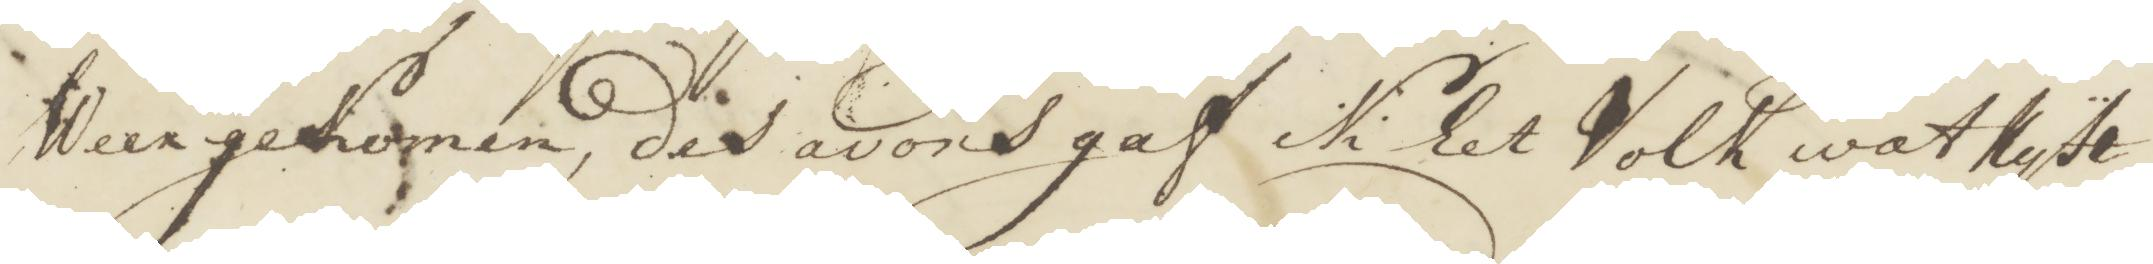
weer gekomen, des avons gaf ik het volk wat rijst
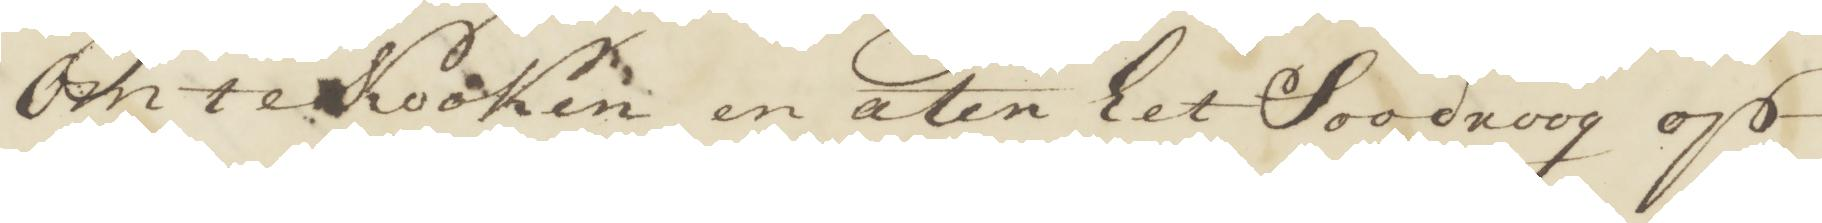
om te kooken en aten het Soo droog op
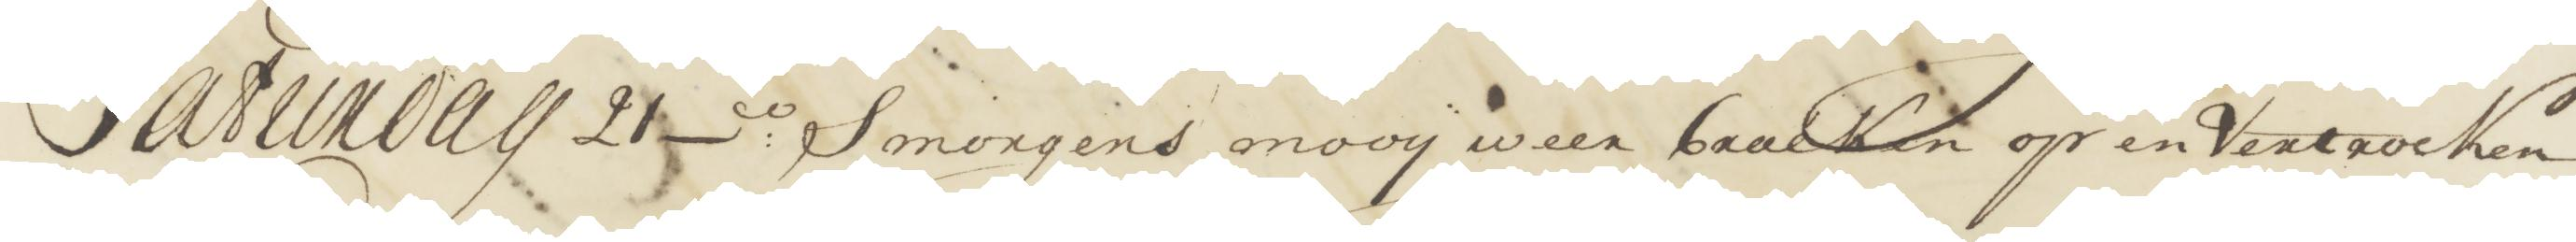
Saturdag 21 _:o Smorgens mooij weer braeken op en vertrocken
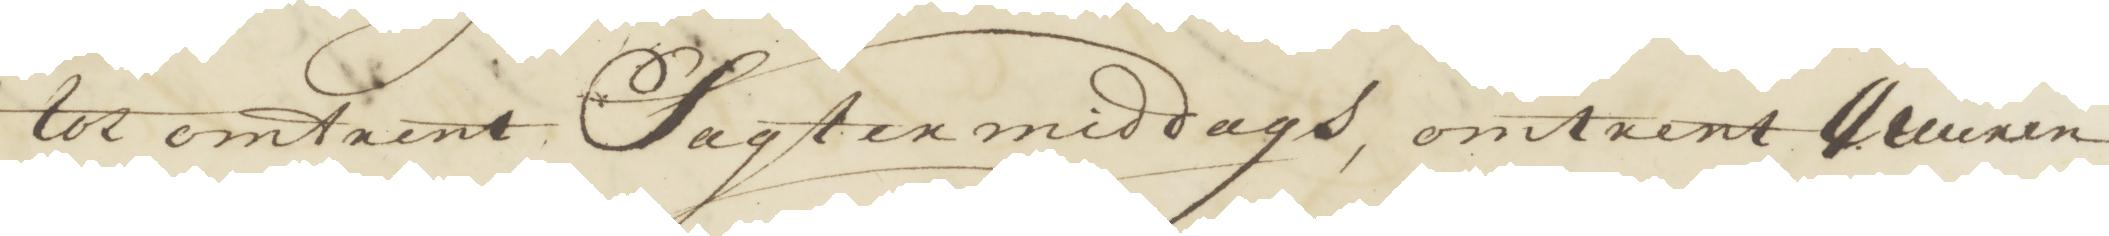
tot omtrent Sagter middags, omtrent 4 uuren
